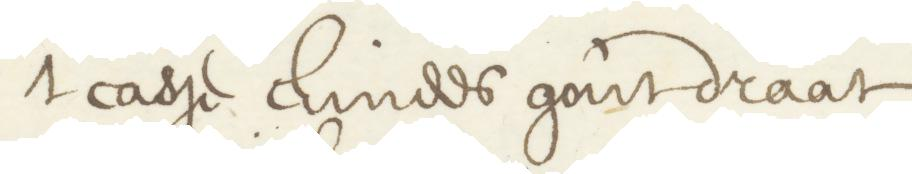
1 casje chinees goutdraat
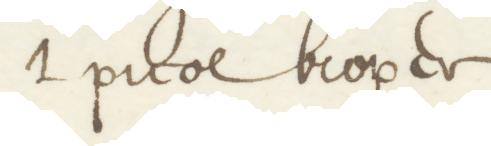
1 picol koper
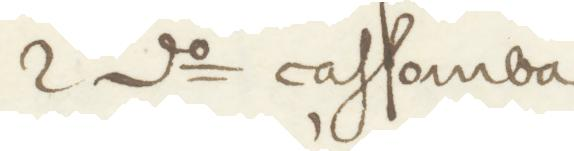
2 d=o cassomba
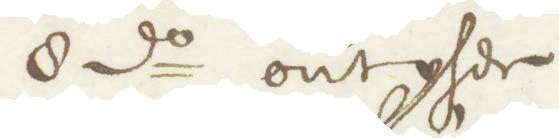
8 d=o out yser
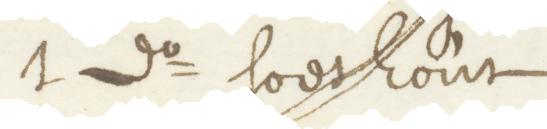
1 d=o soethout
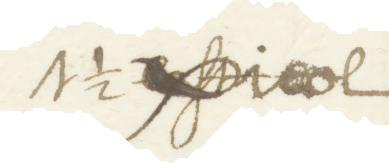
1½ picol
